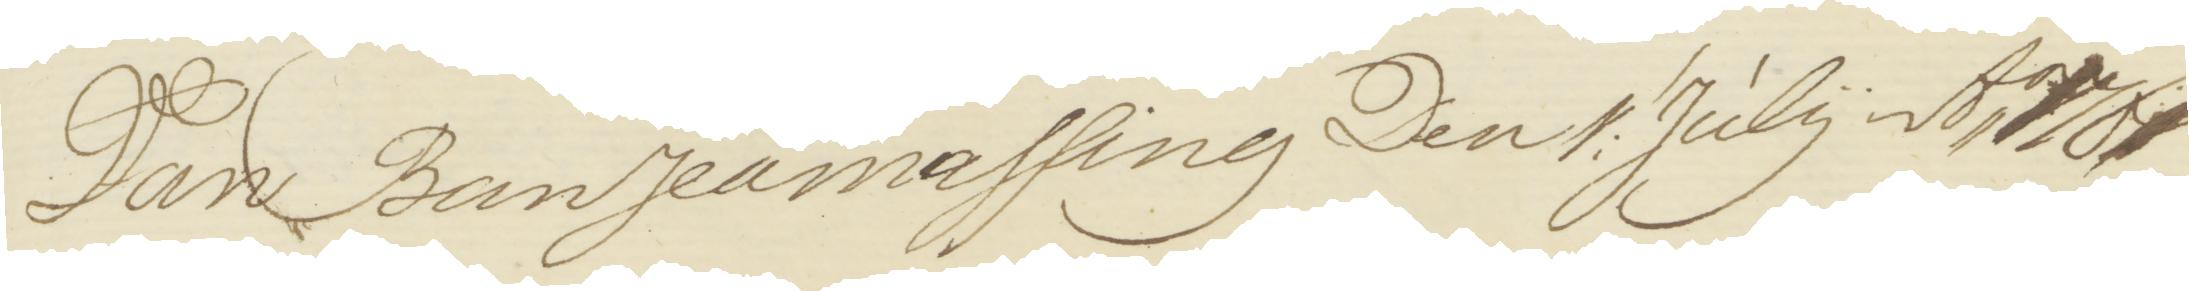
Van Banjermassing Den 1:' Julij A„o 1761
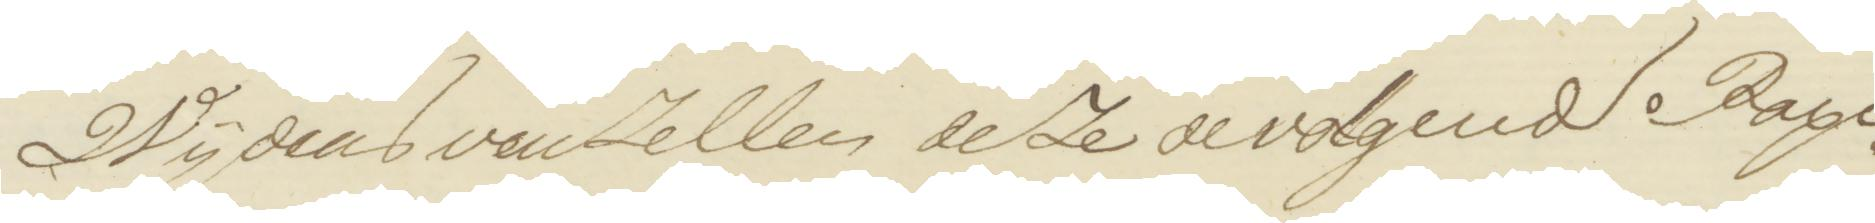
Wijders verzellen deze de volgende Papi„
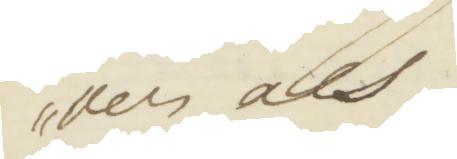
„ren als.
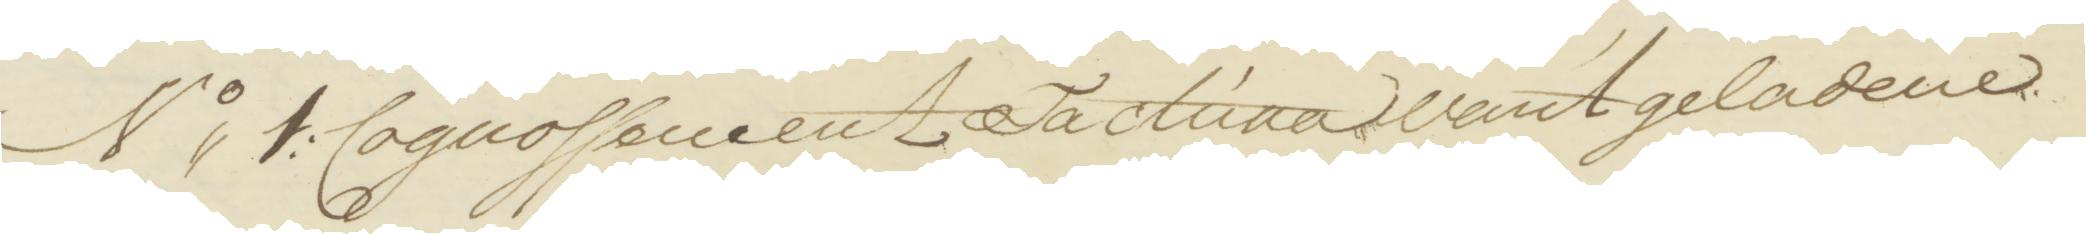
N„o 1: Cognossement Factura van't geladene
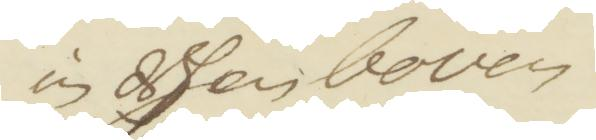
in desen boven
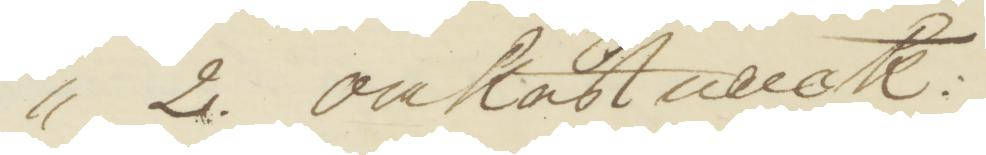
„ 2. onkost reeck:
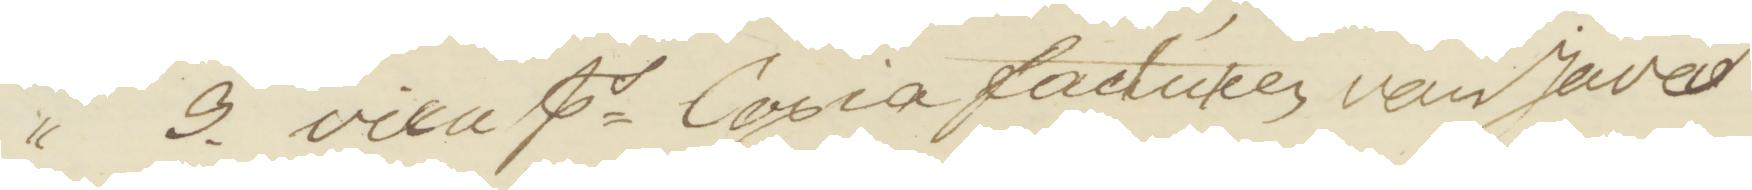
„ 3. vier p=s Copia facturen van Java
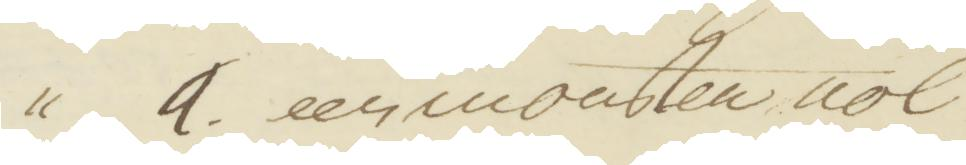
„ 4. een monster rol
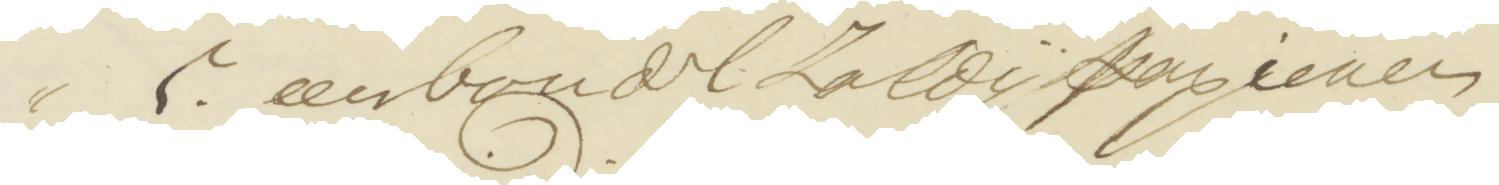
„ 5. een bondel zoldij papieren
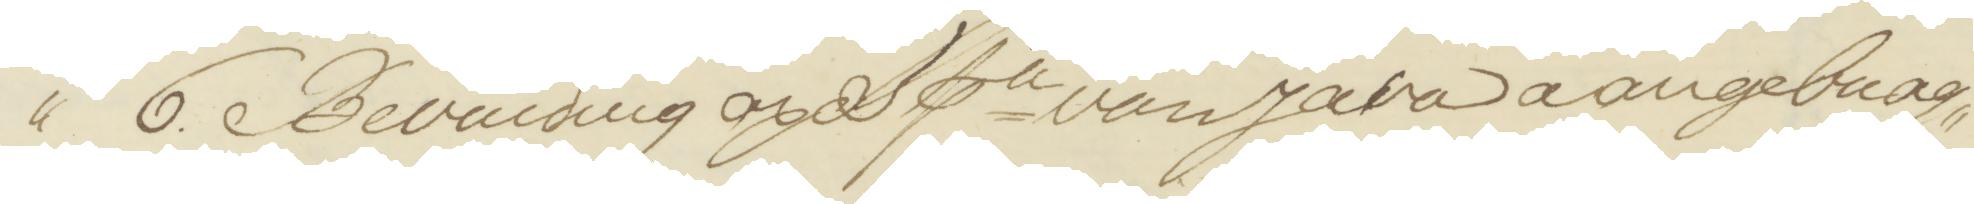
„ 6. Bevinding op de p=r van Java aangebrag
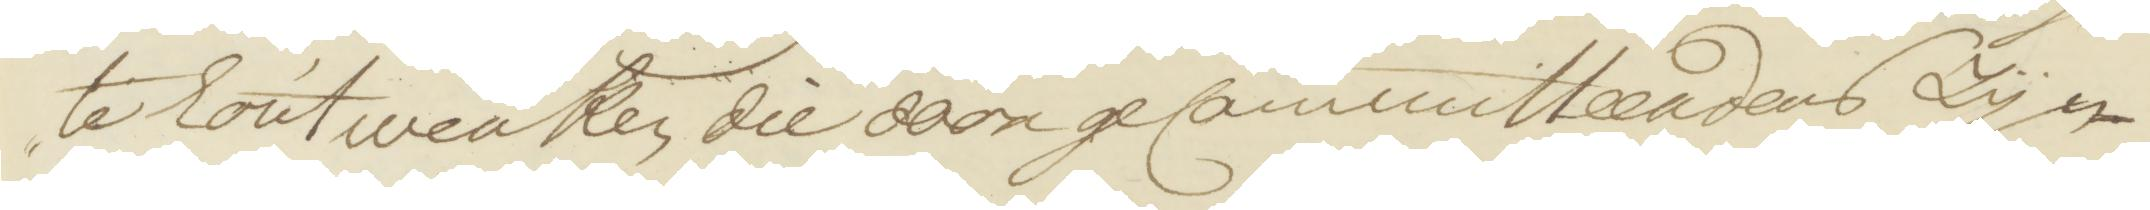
„te houtwerken die door gecommitteerdens zijn
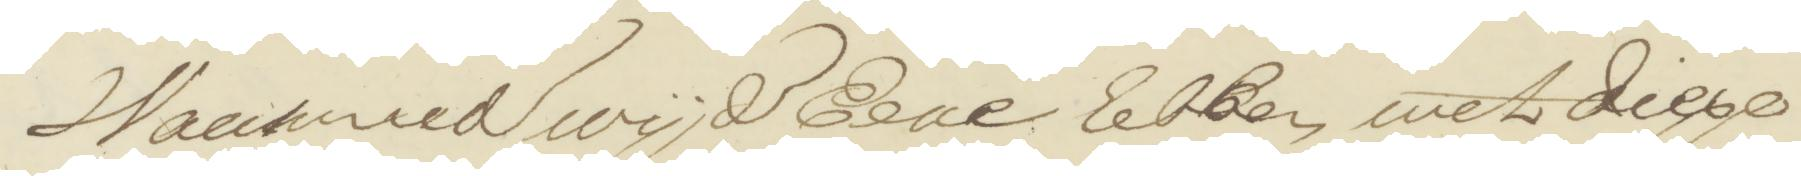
Waarmede wij de Eere hebben met diepe
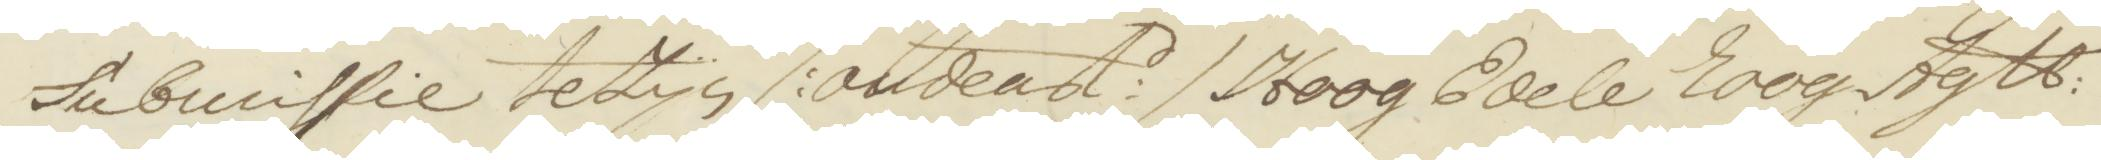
submissie te zijn /:onderst:d/ Hoog Edele hoog Agtb:
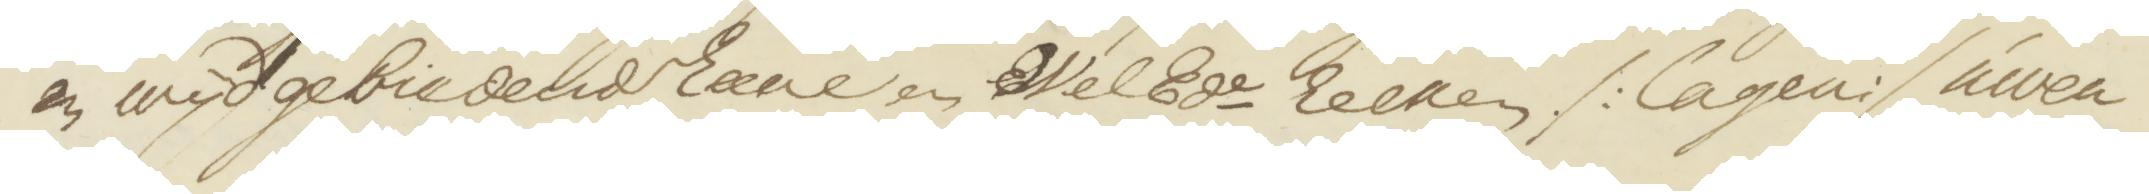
en wijd gebiedende heere en Wel Ed-e heeren /:lager:/ uwer
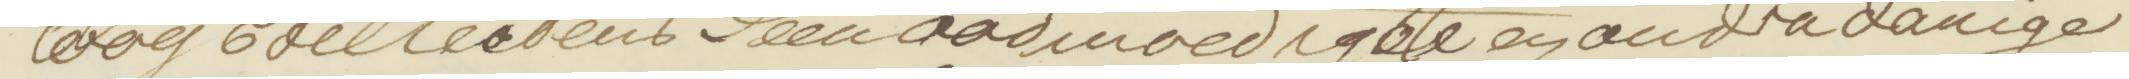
hoog Edelheedens seer oodmoedigste en onderdanige
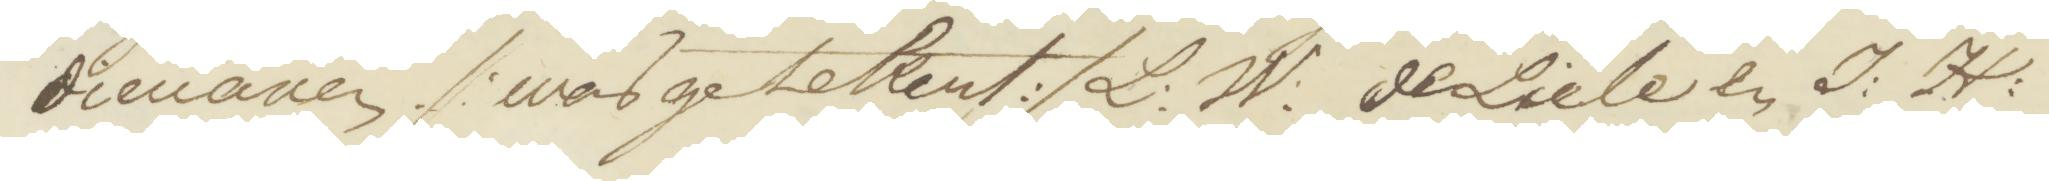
dienaren ./: was getekent :/ L: W: de Liele en I: H:
